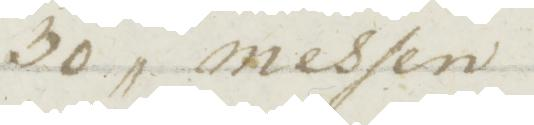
30 „ messen
